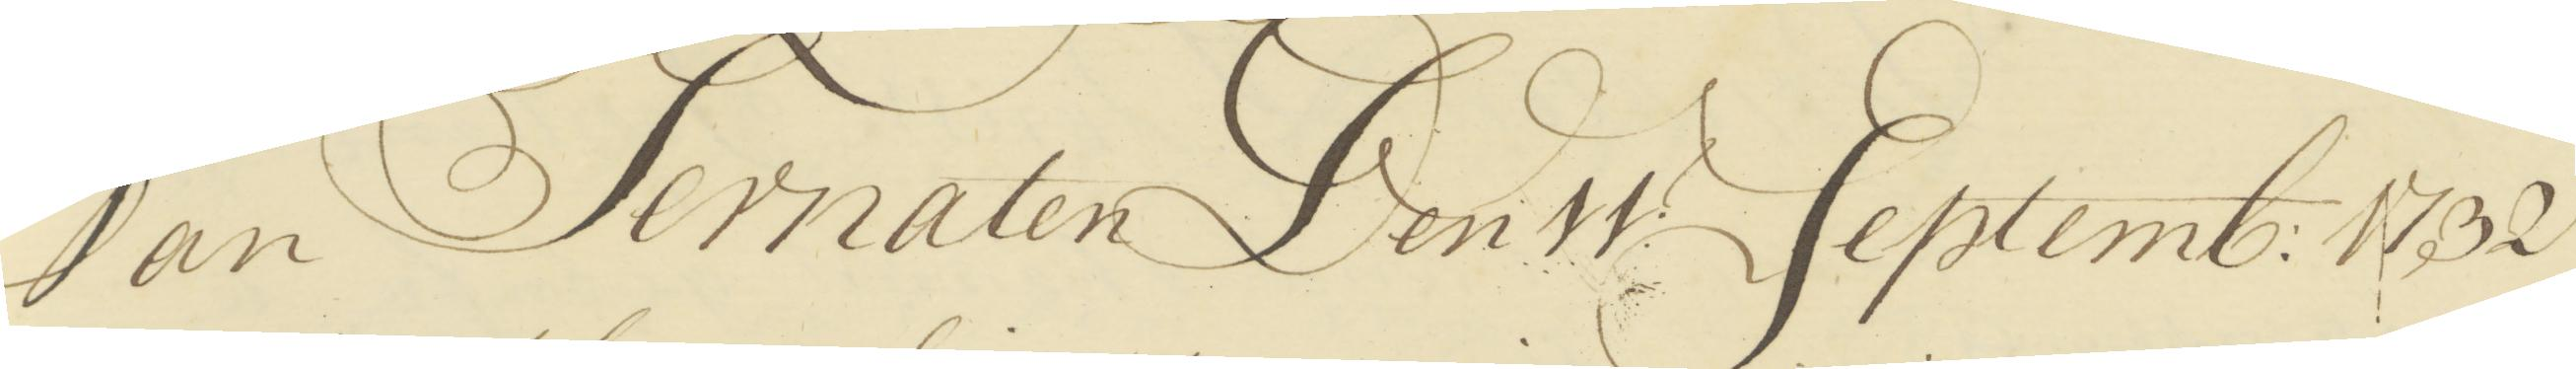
Van Ternaten Den 11:' Septemb: 1732
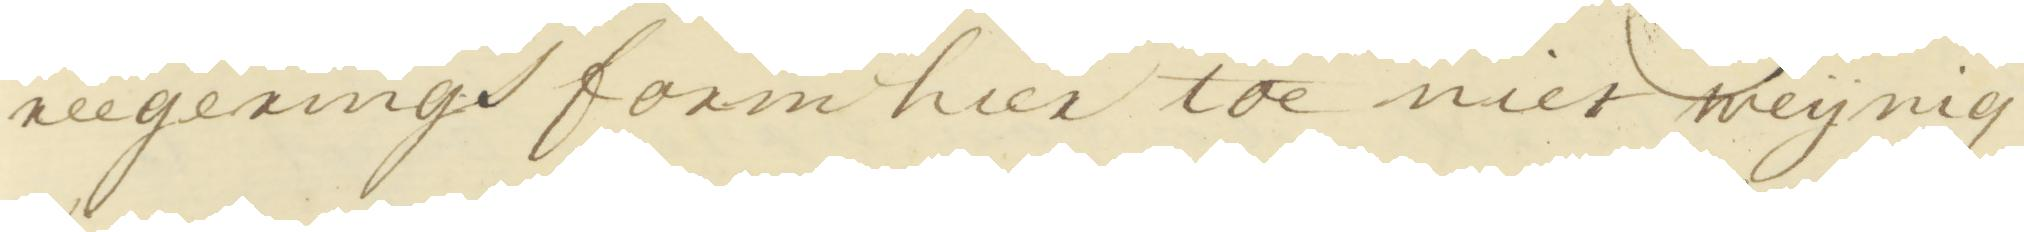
reegerings form hier toe niet weijnig
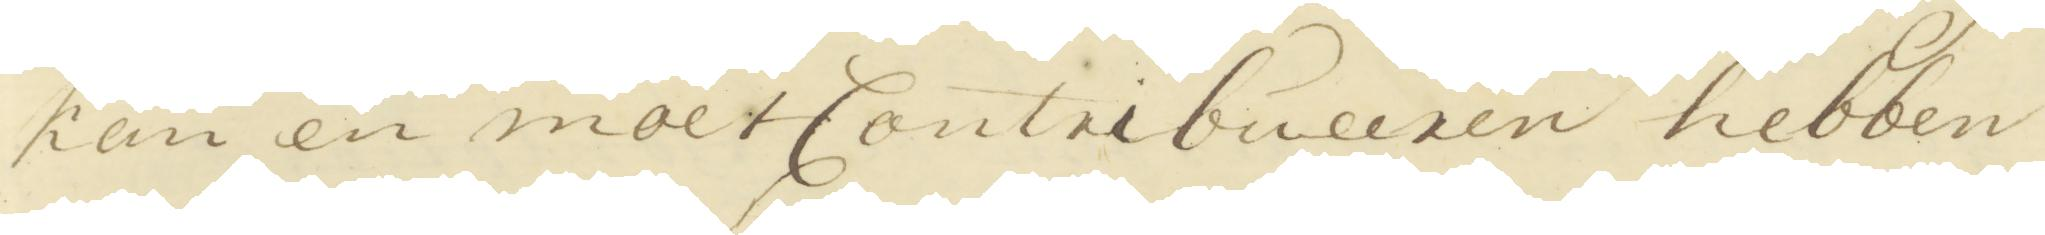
kan en moet Contribueeren hebben
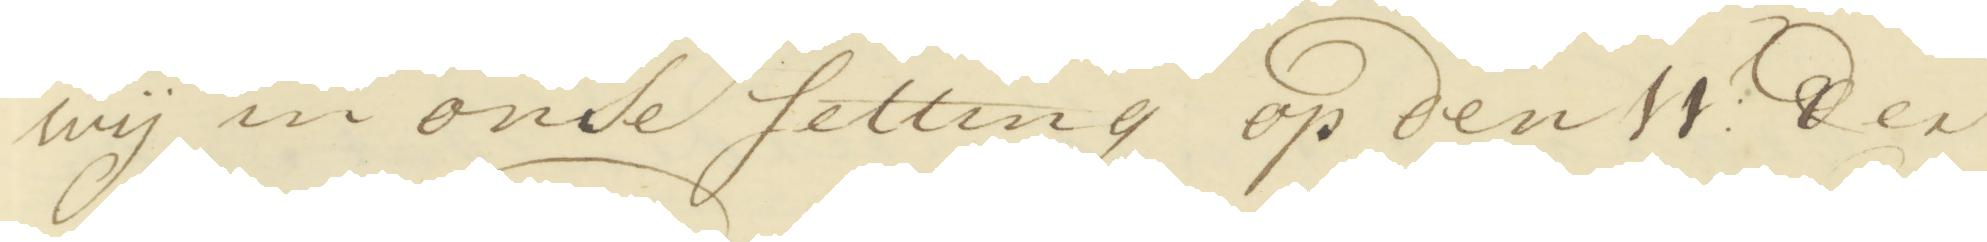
wij in onse setting op den 11:' der
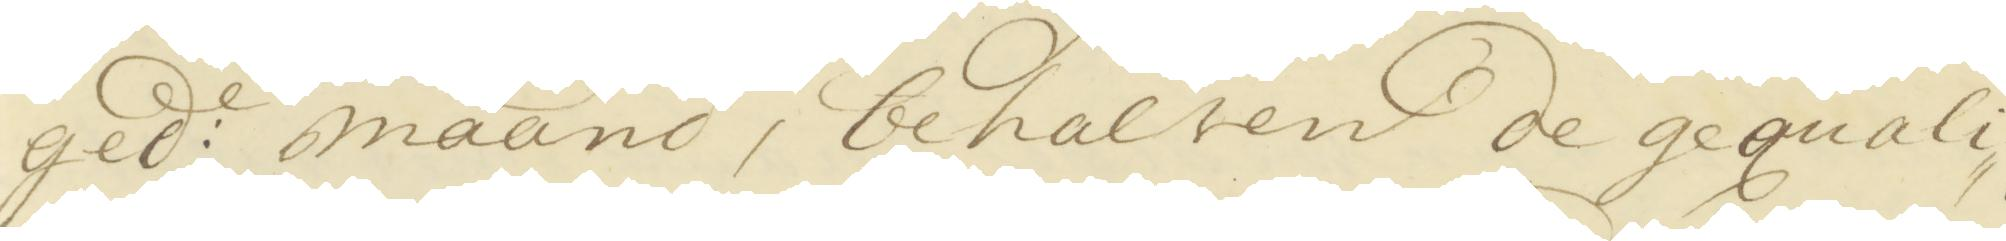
ged:e maand, behalten de gequali„
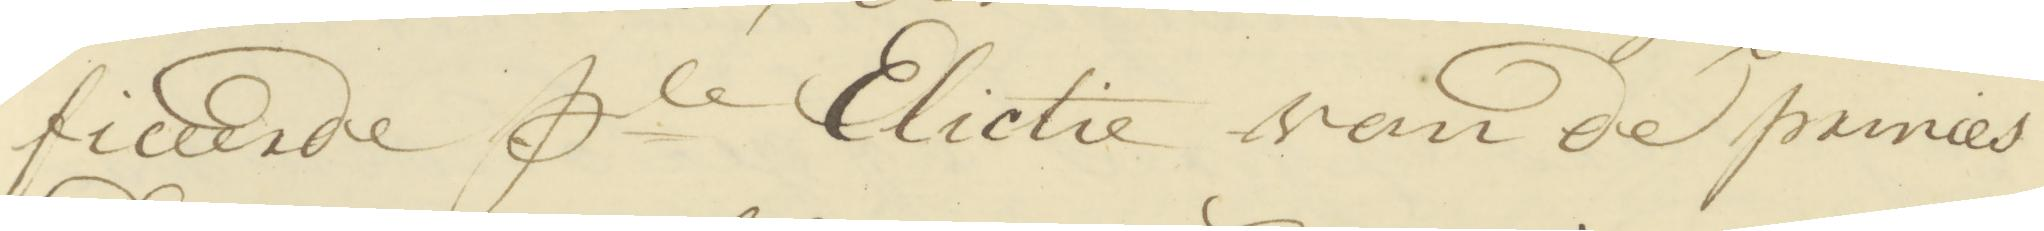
ficeerde p=le Elictie van de princes
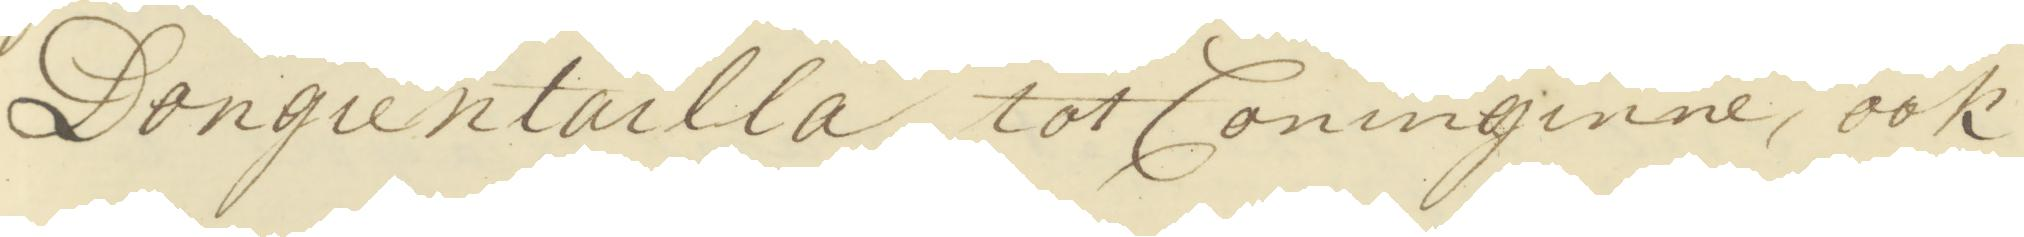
Dongientailla tot Coninginne, ook
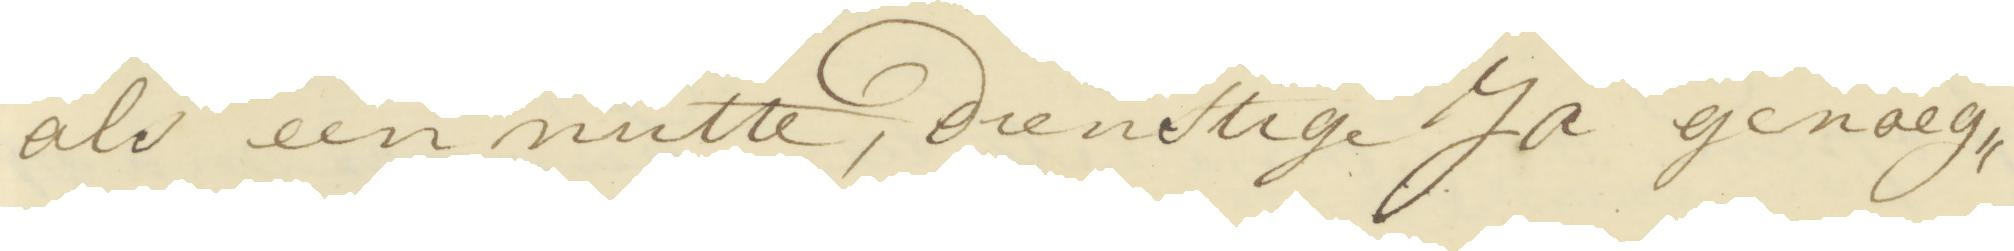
als een nutte, dienstige Ja genoeg„
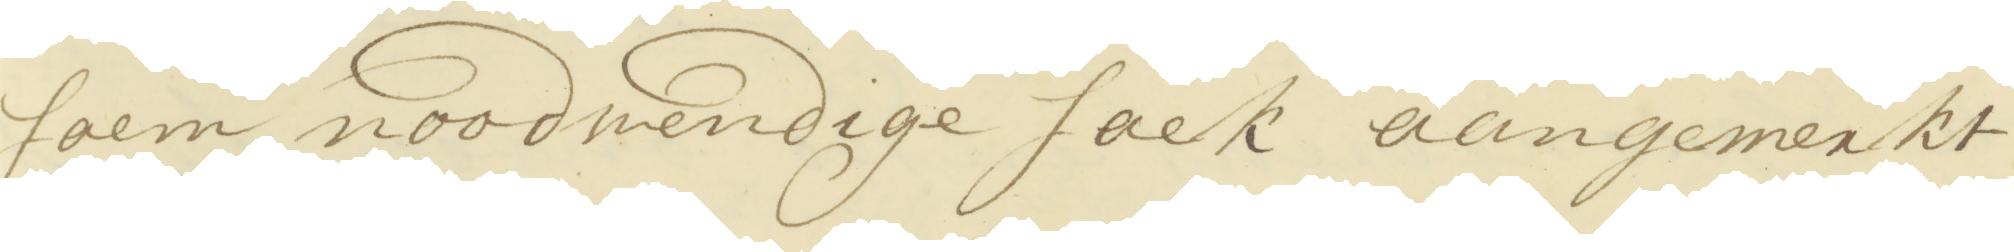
saem noodwendige saek aangemerkt
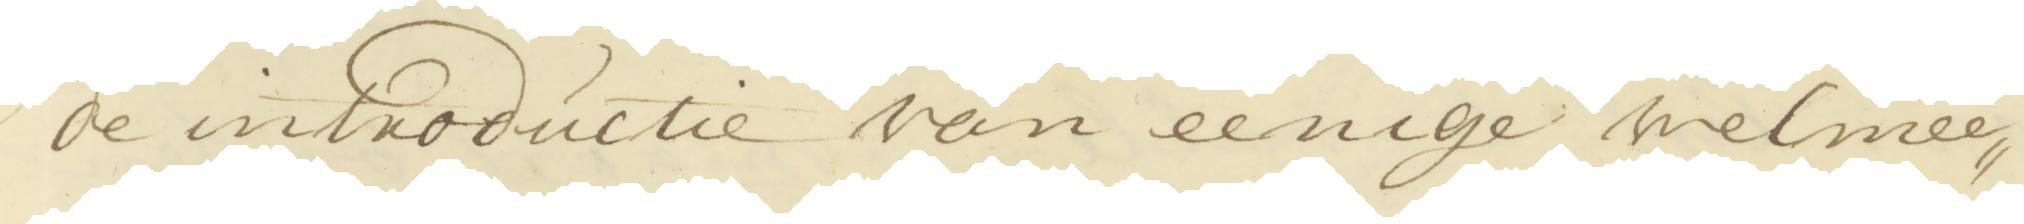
de introductie van eenige wel mee„
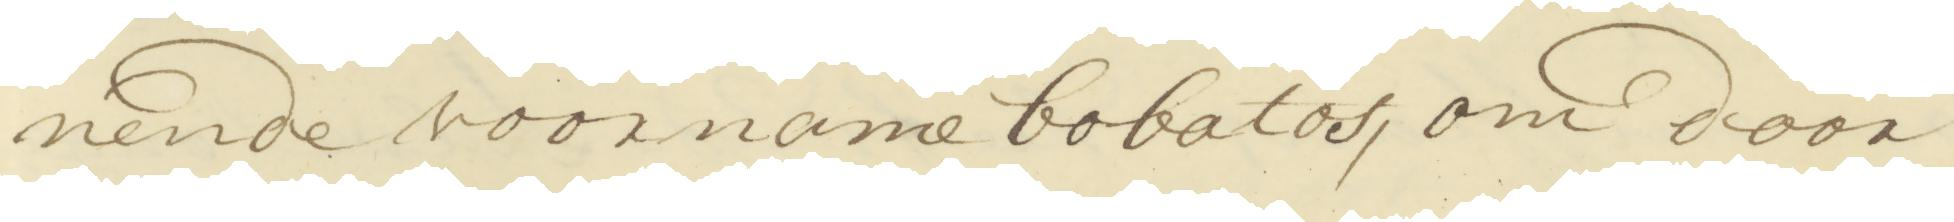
nende voorname bobatos, om door
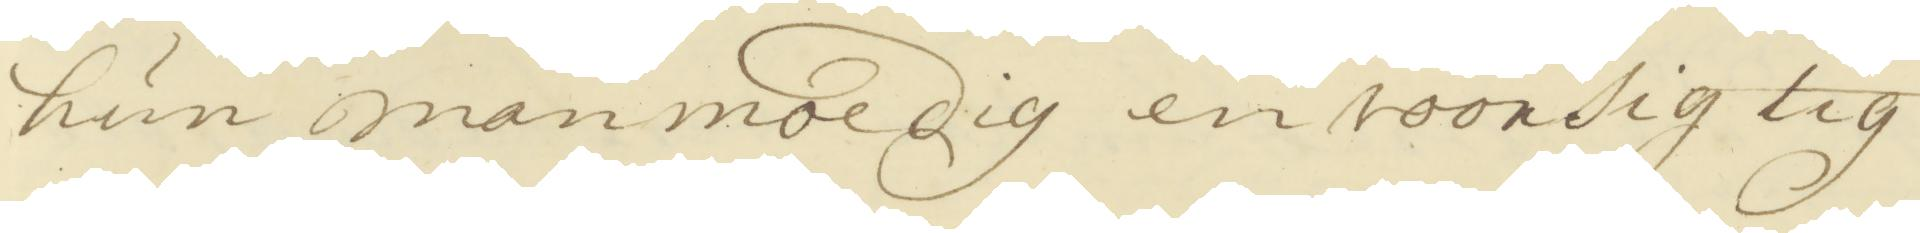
hun manmoedig en voorsig tig
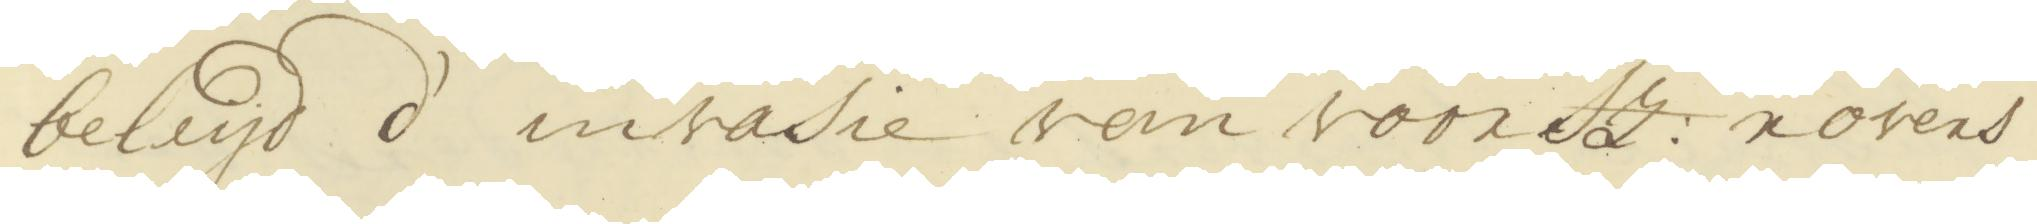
beleijd d' invasie van voorsz: rovers
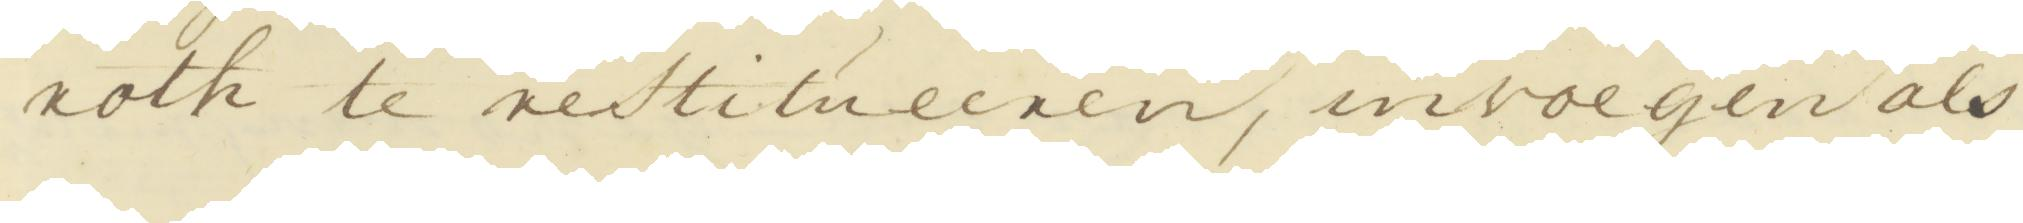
roth te restitueeren, invoegen als
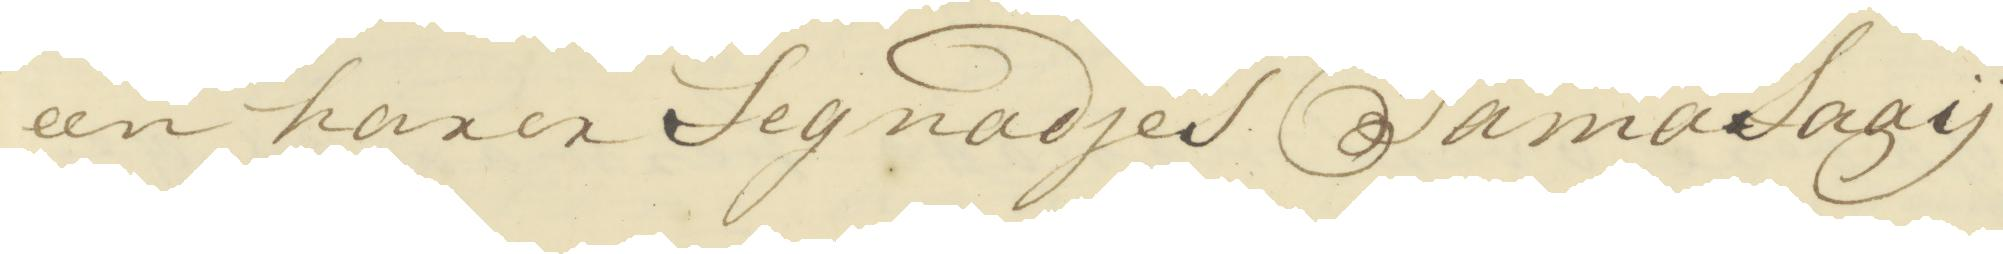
een harer Segnadjes Tama Saaij
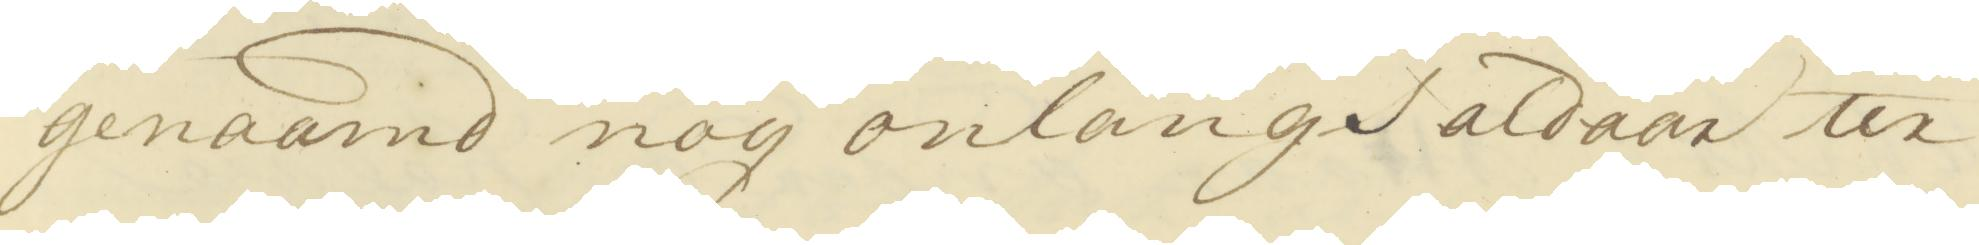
genaamd nog onlangs aldaar ter
